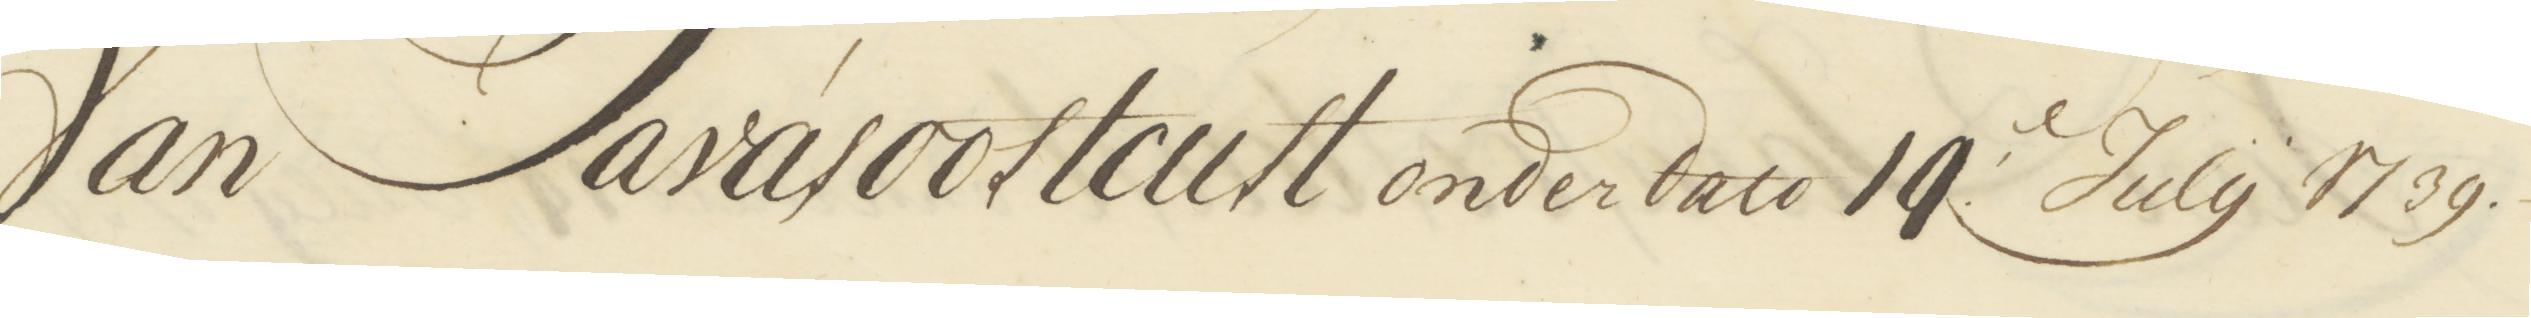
Van Java's oostcust onder dato 14:e Julij 1739.
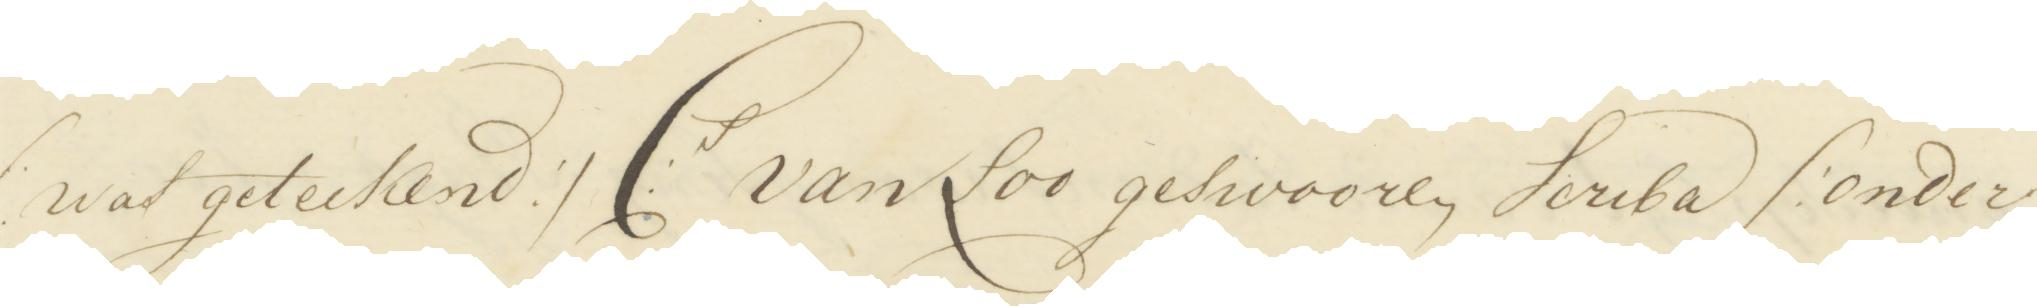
was geteekend:/ C:s van Loo geswooren Scriba /:onder
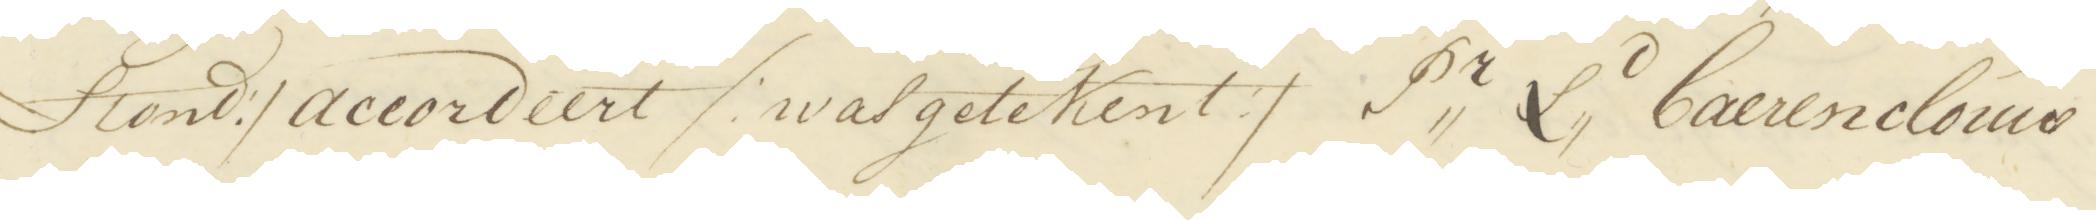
stond:/ accordeert /:was getekent:/ P„r L„d baerenclouw
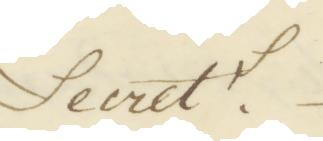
Secret.s
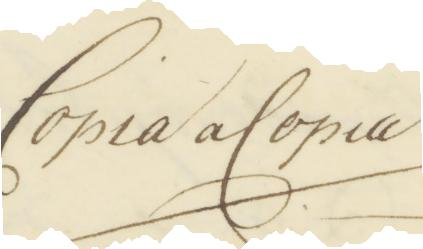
Copia a Copia
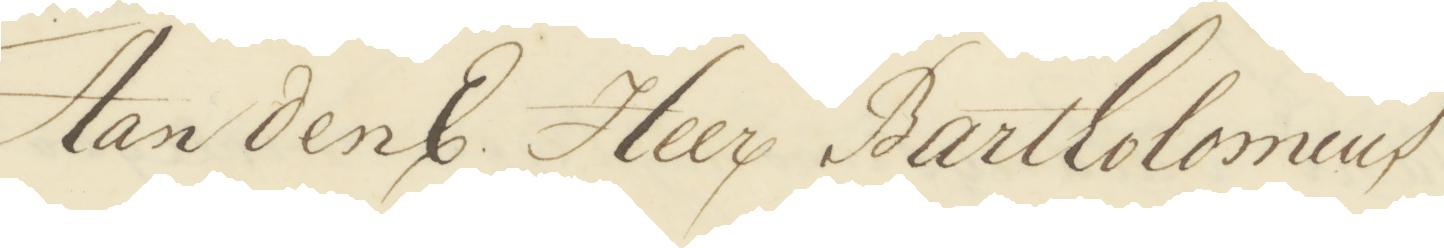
Aan den E. Heer Bartholomeus
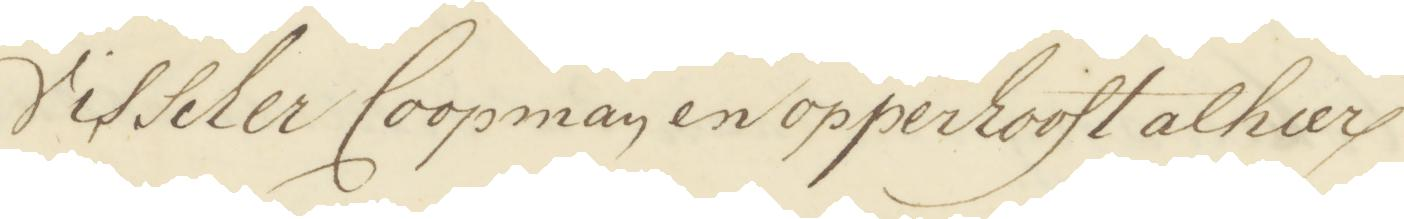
Visscher Coopman en opperhooft alhier
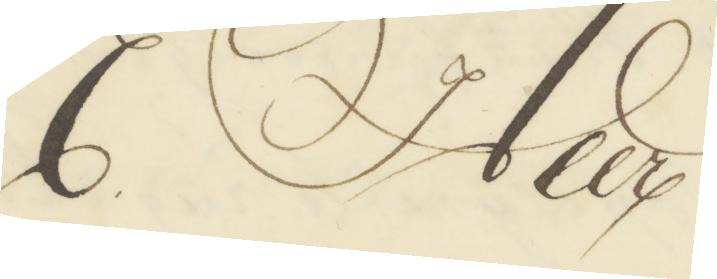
E. Heer
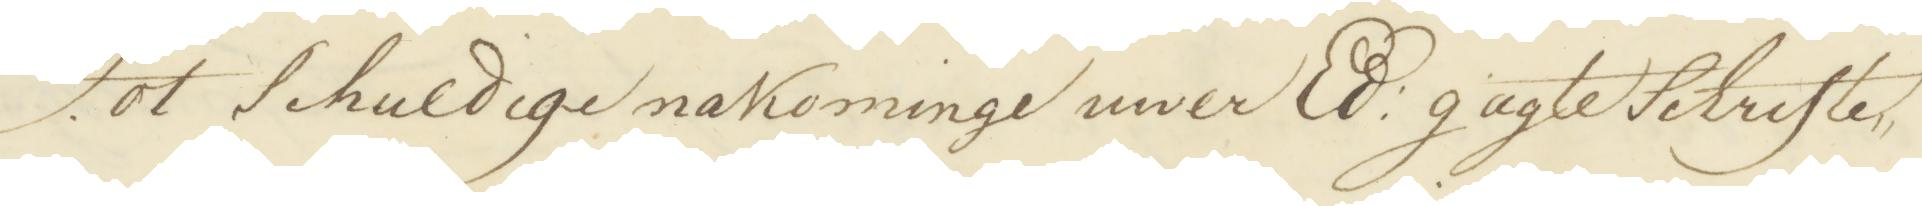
Tot schuldige nakominge uwer Ed: g'agte schrifte„
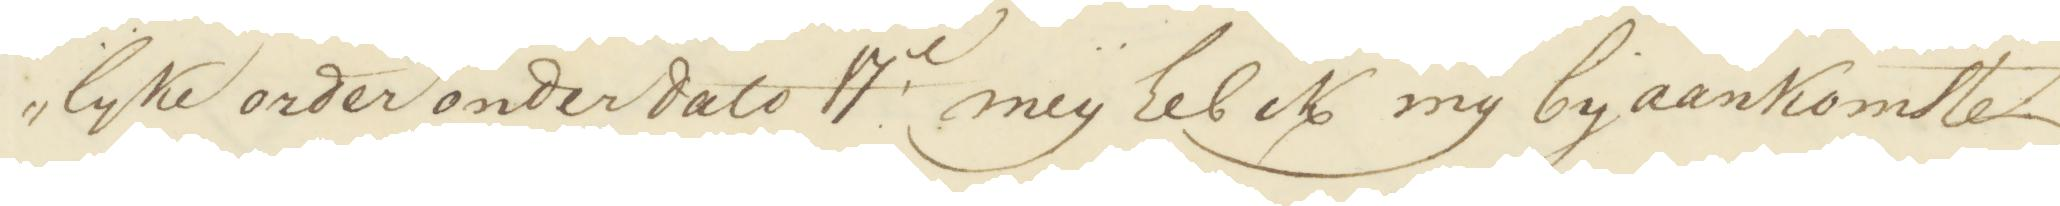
„lyke order onder dato 17:e meij heb ik mij bij aankomste
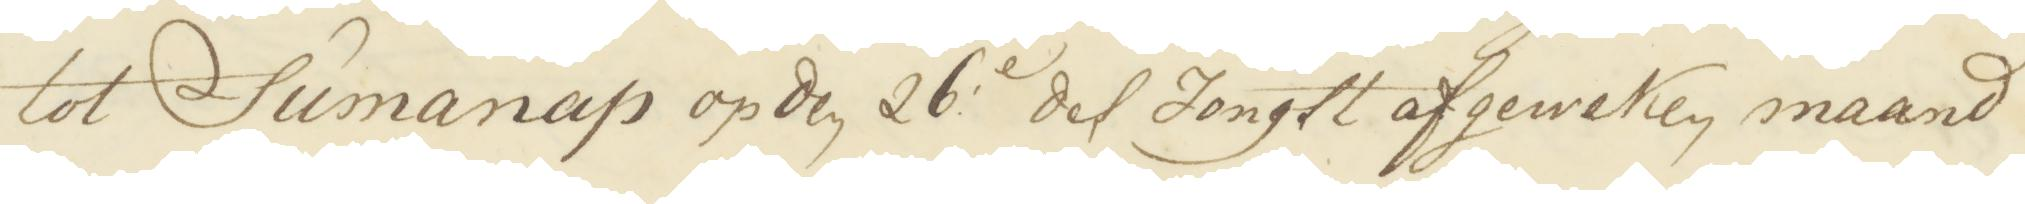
tot Sumanap op den 26:e des Jongst afgeweken maand
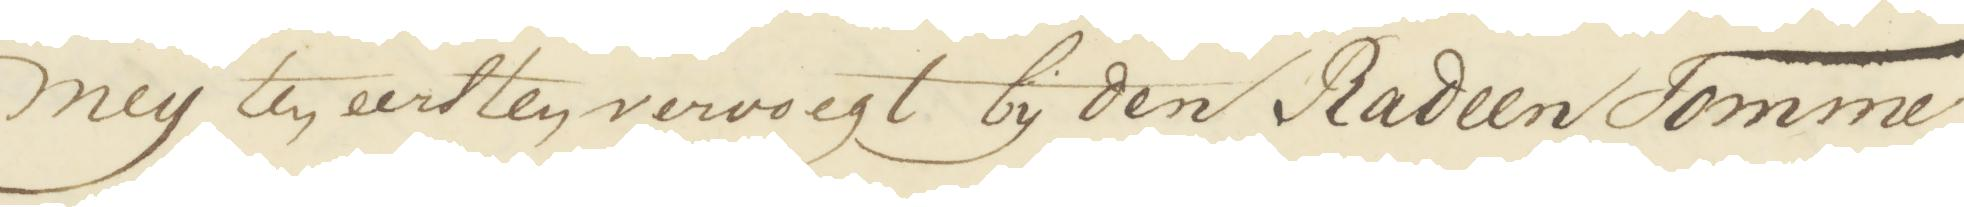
meij ten eersten vervoegt bij den Radeen Tomme
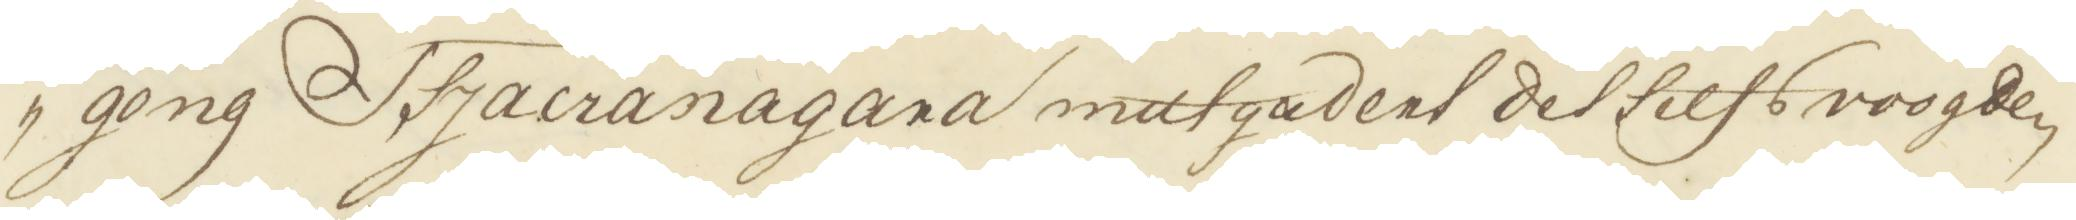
„gong Tsjacranagara mitsgaders des selfs voogden
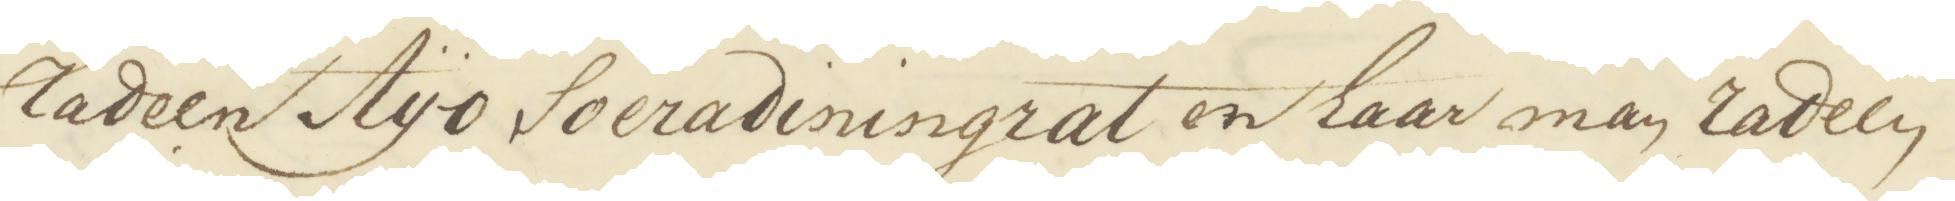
radeen Aijo Soeradiningrat en haar man radeen
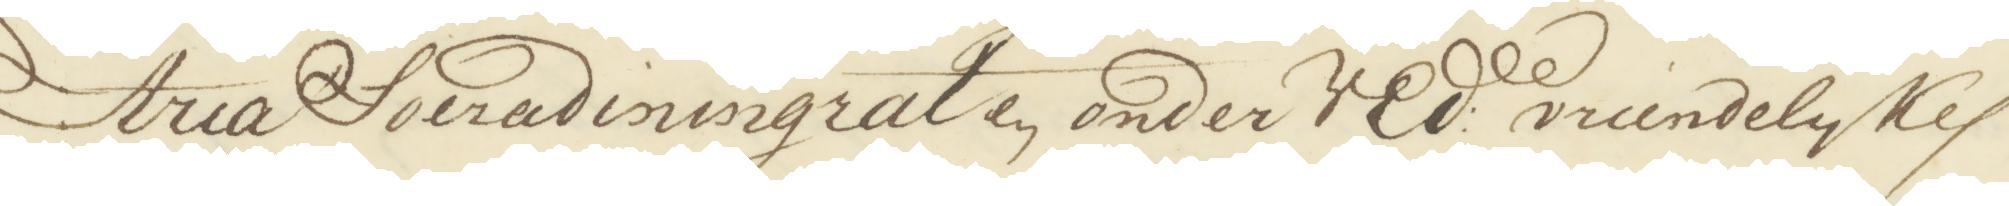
Aria Soeradiningrat en onder VEd:le vriendelijke
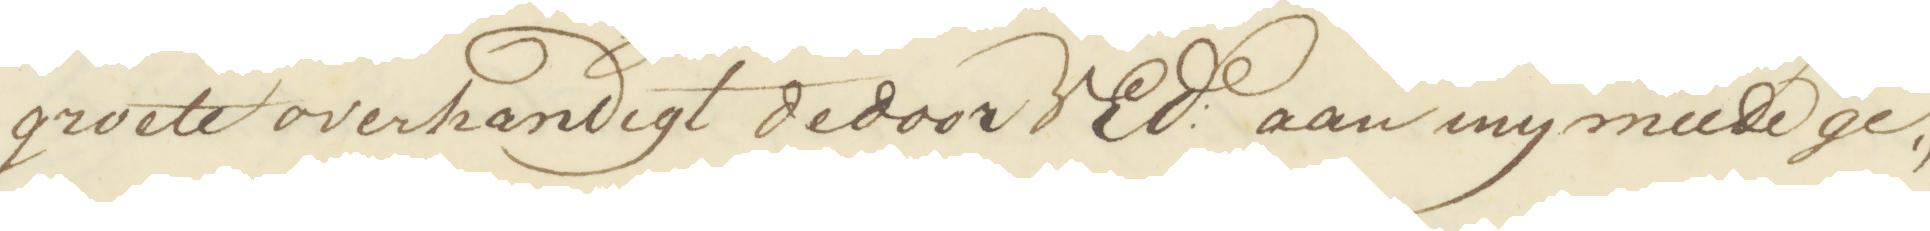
groete overhandigt de door VEd:e aan mij meede ge
